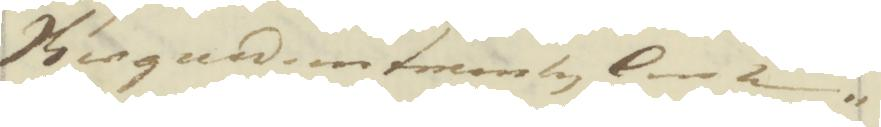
Vier guldens twintig Cent „
